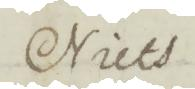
Niets
